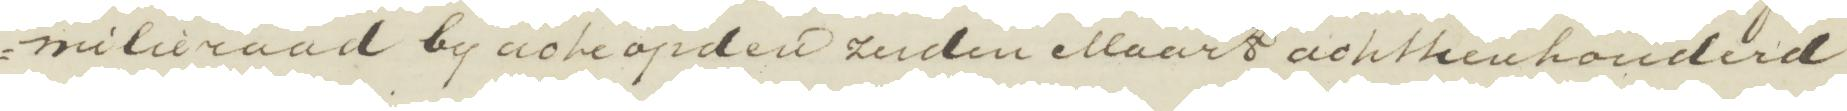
milieraad bij acte op den zesden Maart achttienhonderd
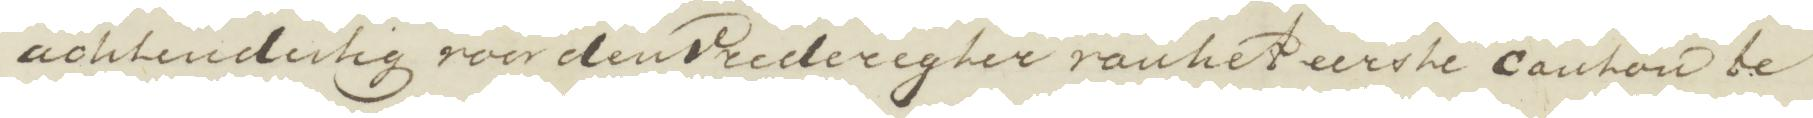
achtendertig voor den Vrederegter vanhet eerste canton te
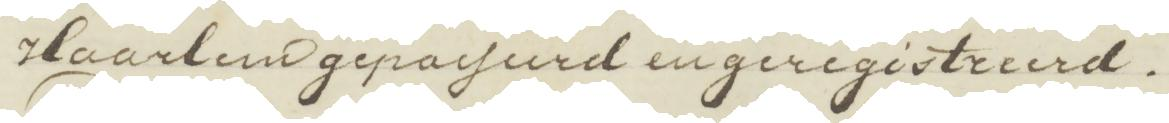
Haarlem gepasseerd en geregistreerd.
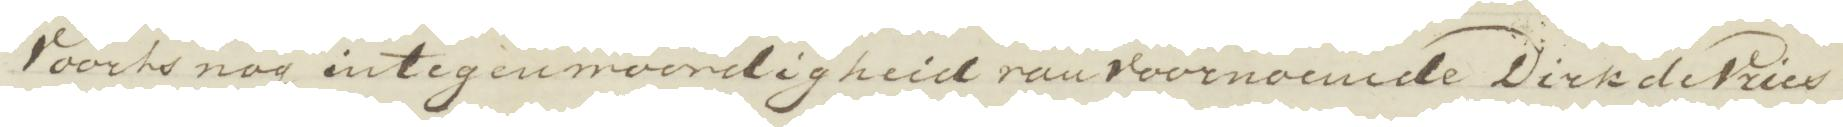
Voorts nog integenwoordigheid van voornoemde Dirk de Vries
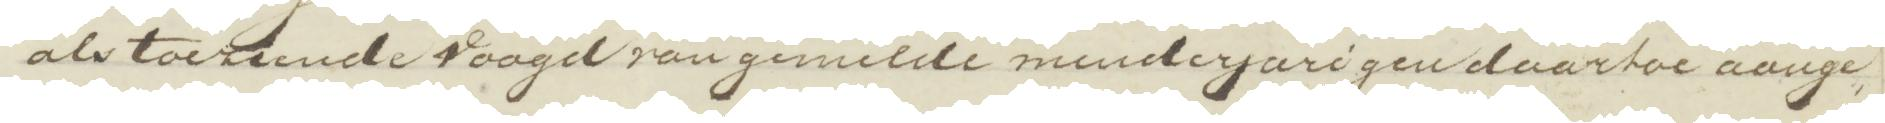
als toeziende Voogd van gemelde minderjarigen daartoe aange„
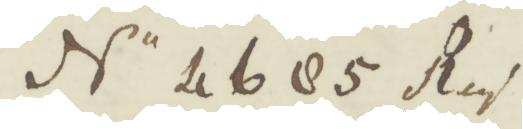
No 4685 Reg.
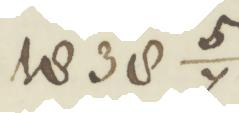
1838 5/7
